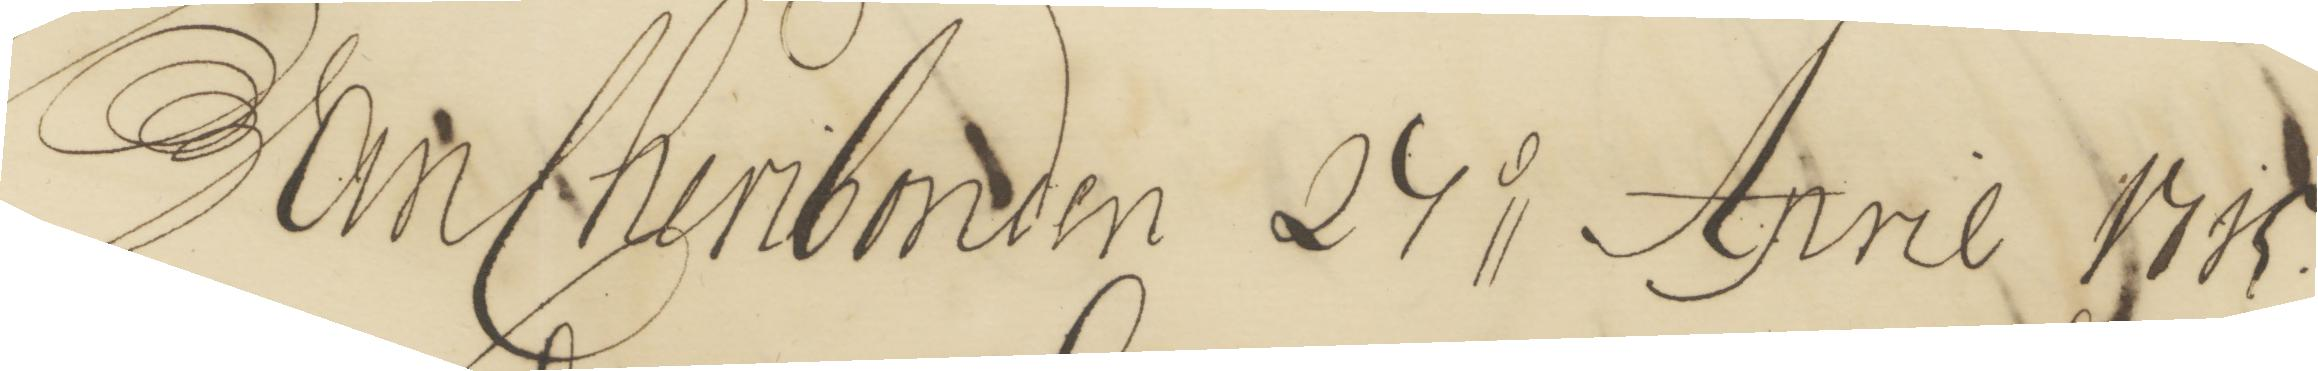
Van Cheribon den 27„' April 1715
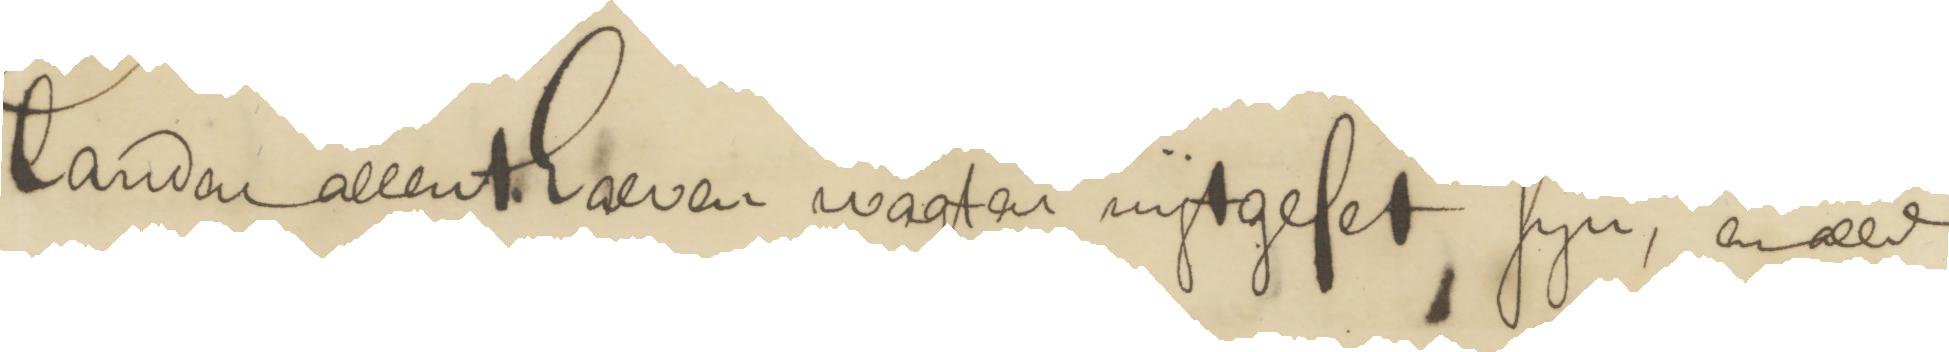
landen allenthalven wagten uijtgeset sijn, en alle
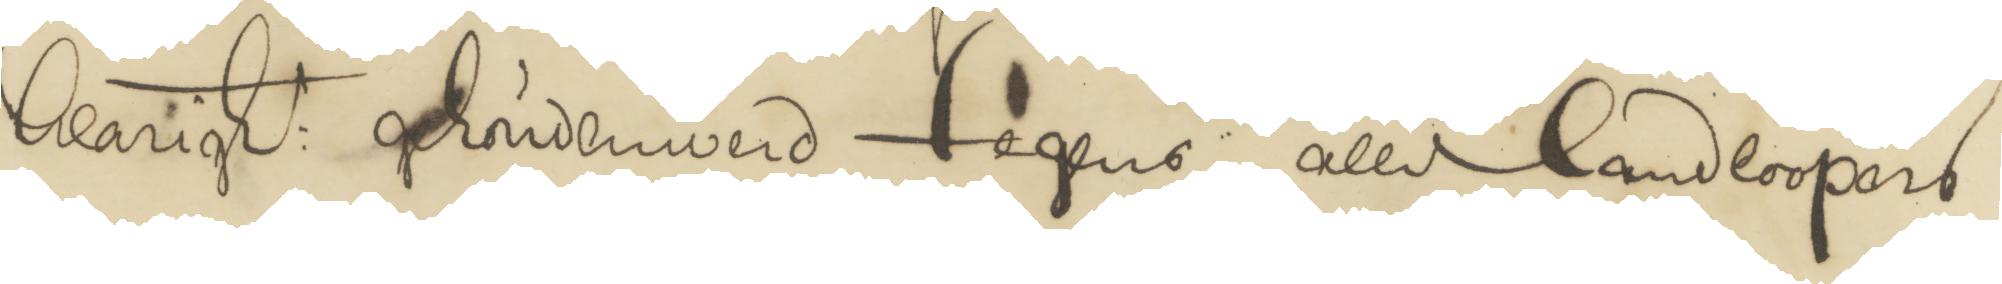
klarigh:t gehouden werd tegens alle landloopers
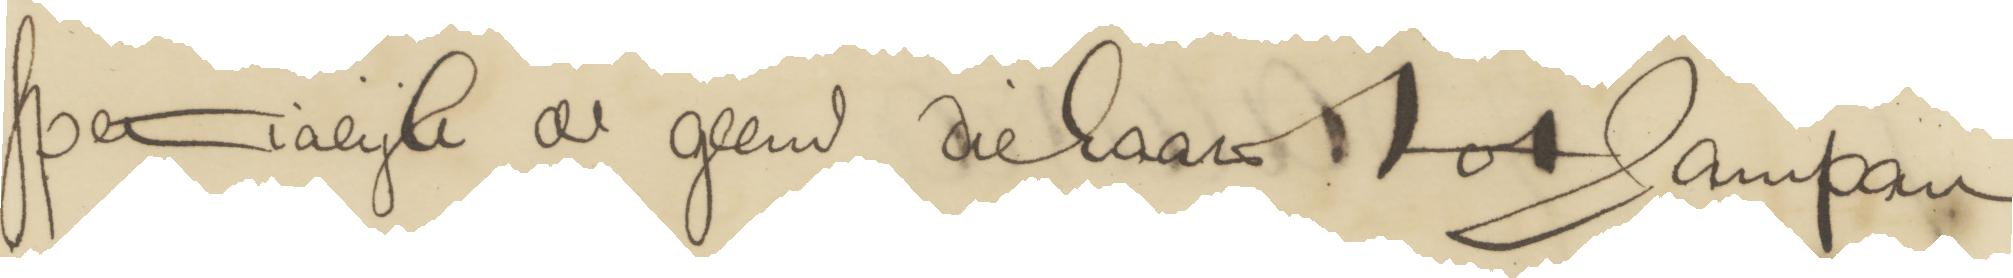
specialijk de geene die haar tot Jampan
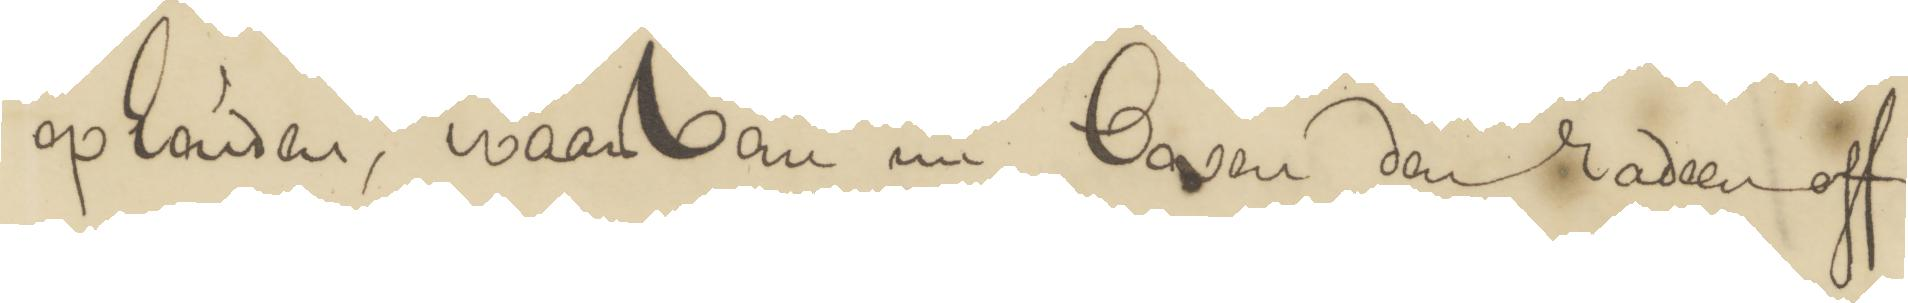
op houden, waarvan nu boven den raden off
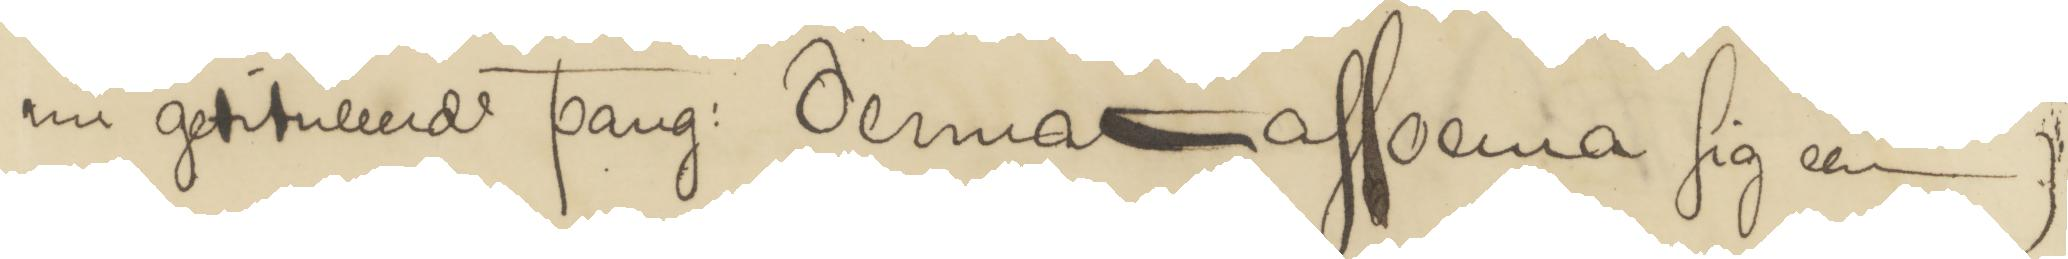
nu getituleerde pang: denna cassoema sig een
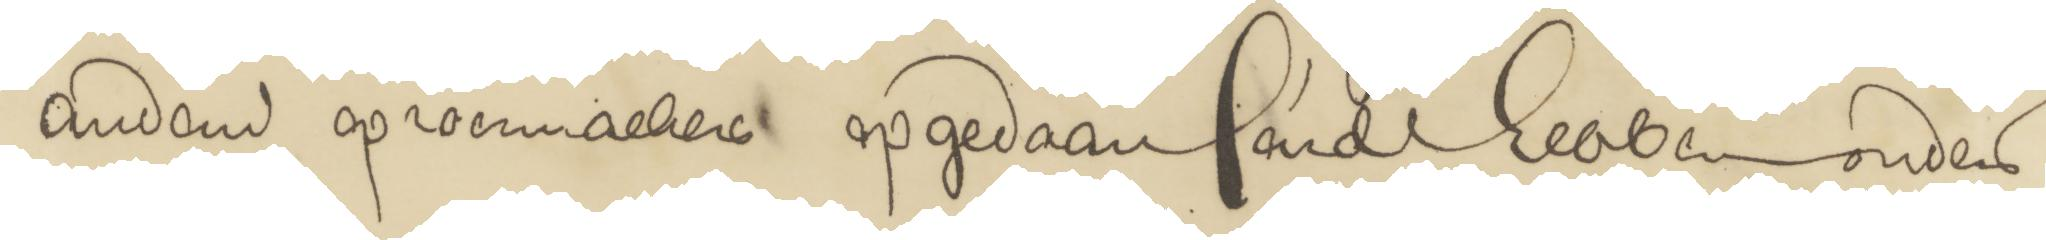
andere op roermaeker op gedaan soude hebben onder
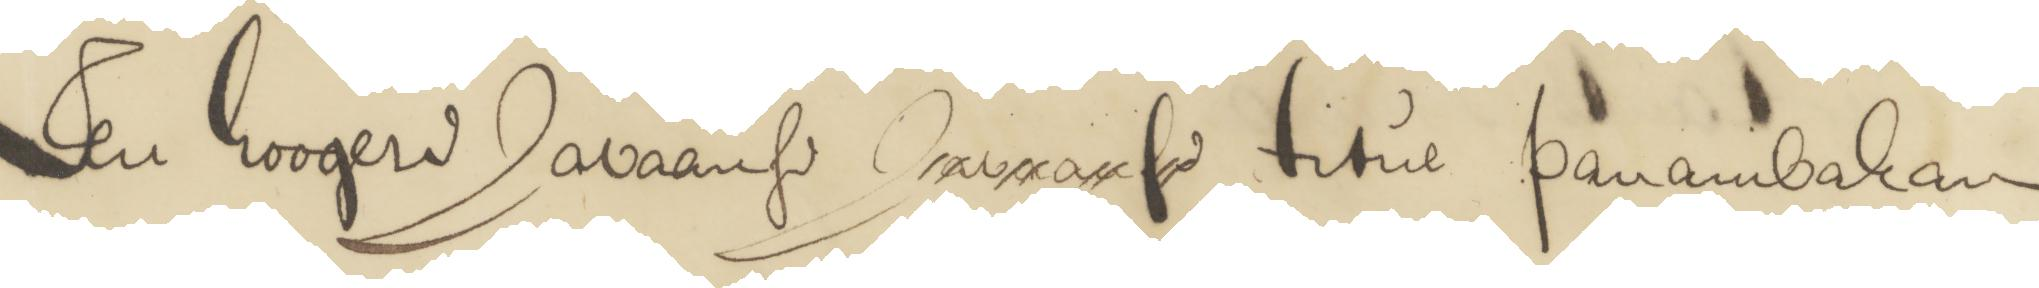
Een hoogere Javaanse Javaanse titul panambahan
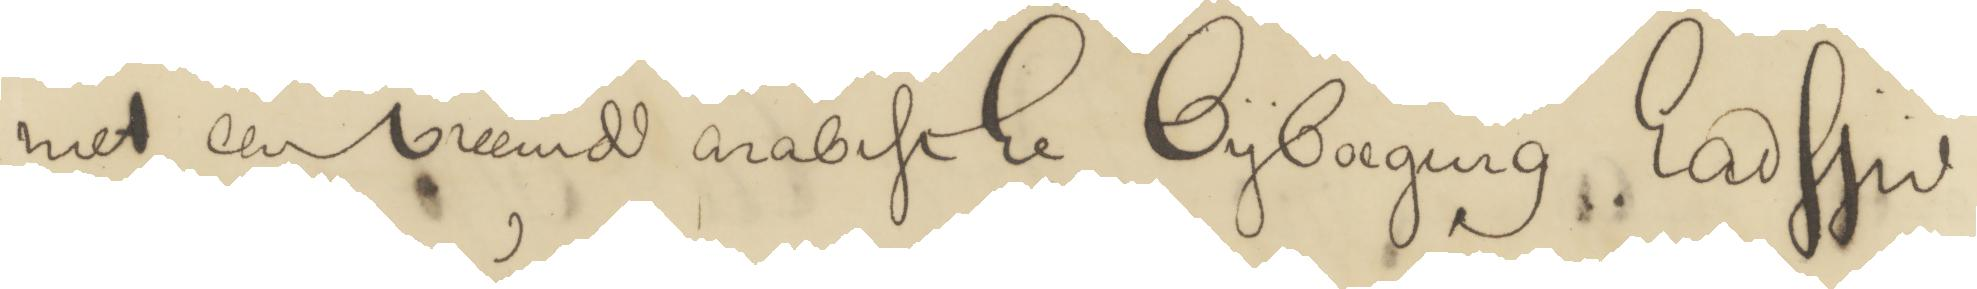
met een vreemde arabische bijvoeging hadsjie
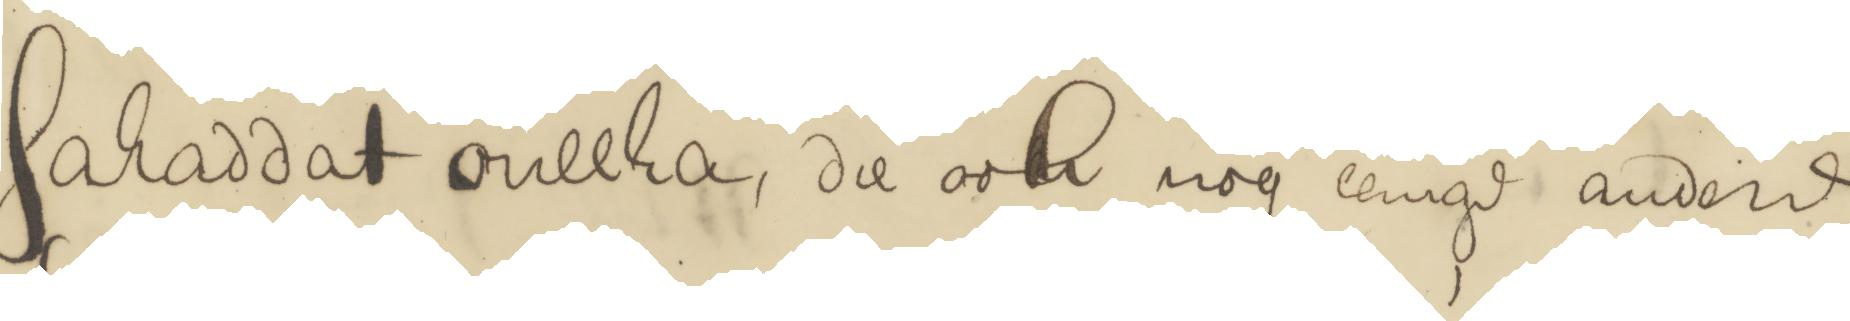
sahaddat oullha, de ook nog eenige andere
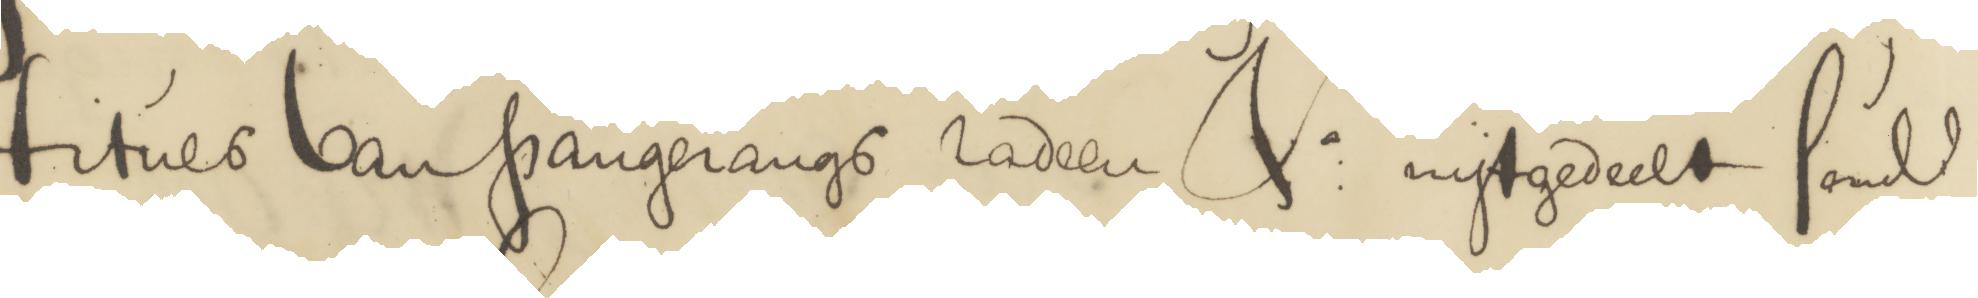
tituls van pangerangs radeen &:a uijtgedeelt soude
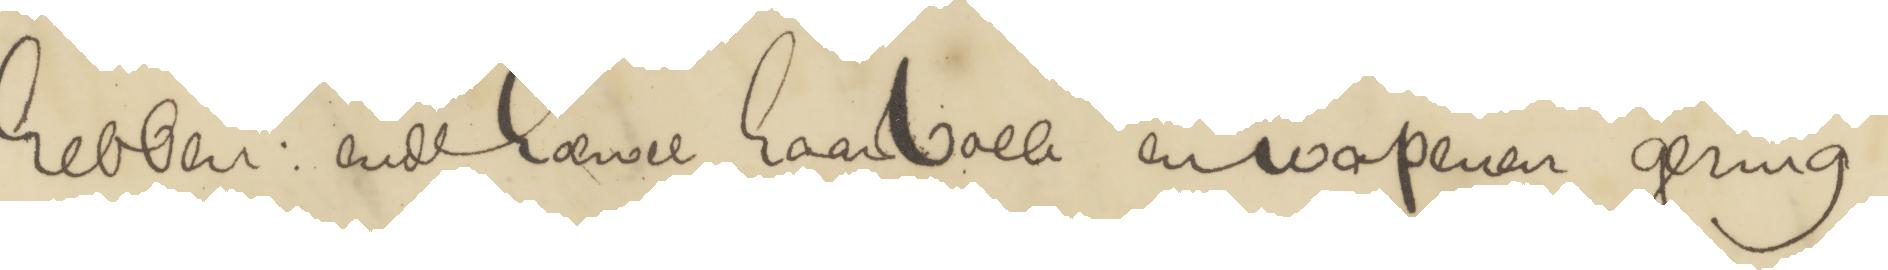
hebben: ende hoewel haar volk en wapenen gering
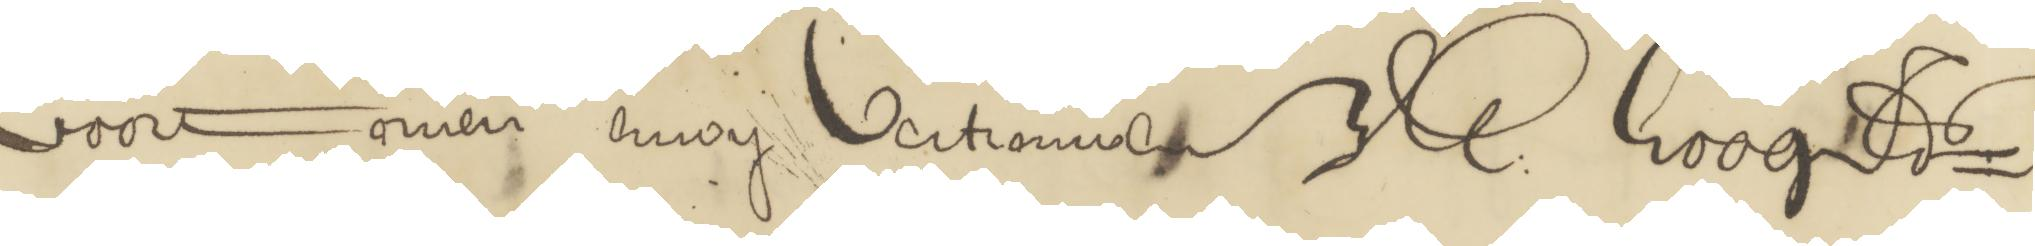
voorcomen enwij Vertrouwen VE: hoog Ed=s
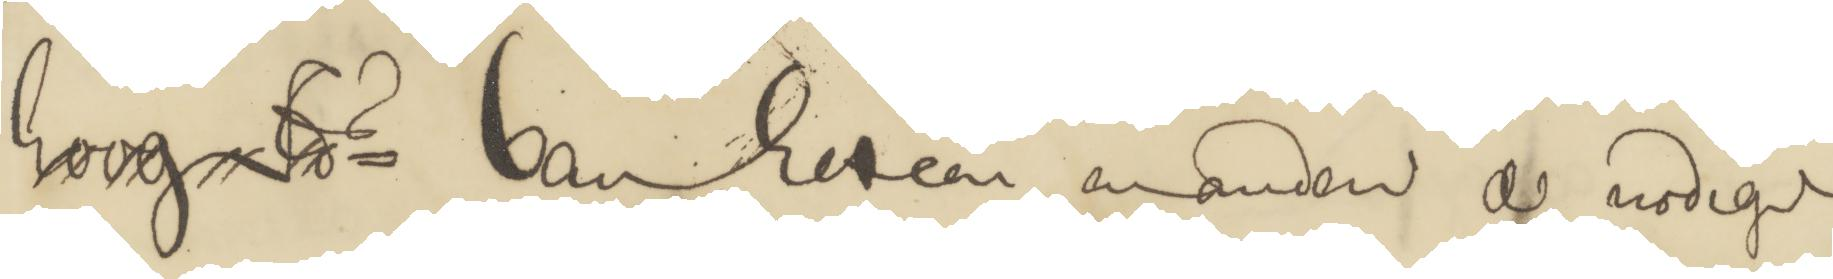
hoog Ed=s van het een en andere de nodige
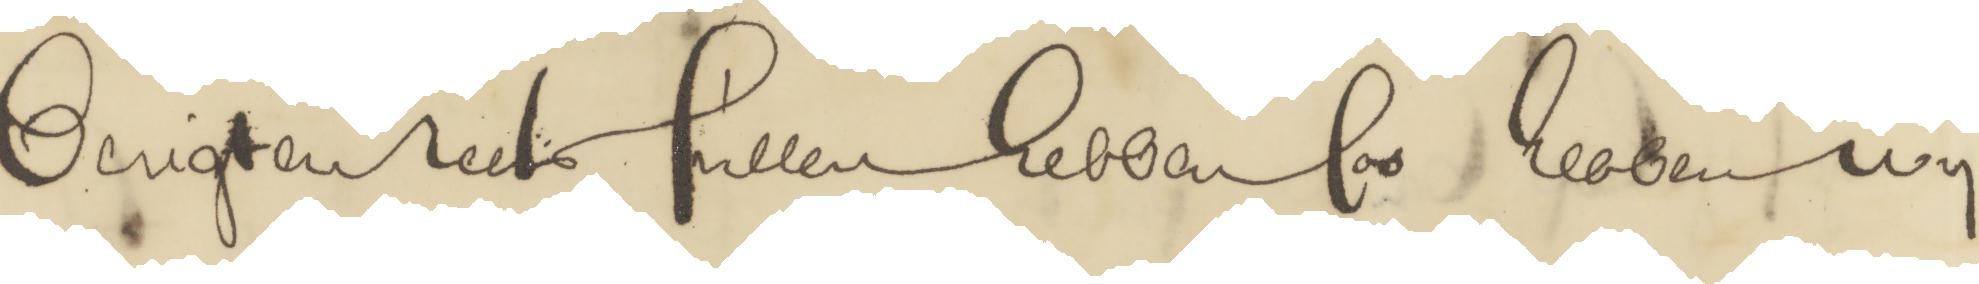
berigten reets sullen hebben soo hebben wij
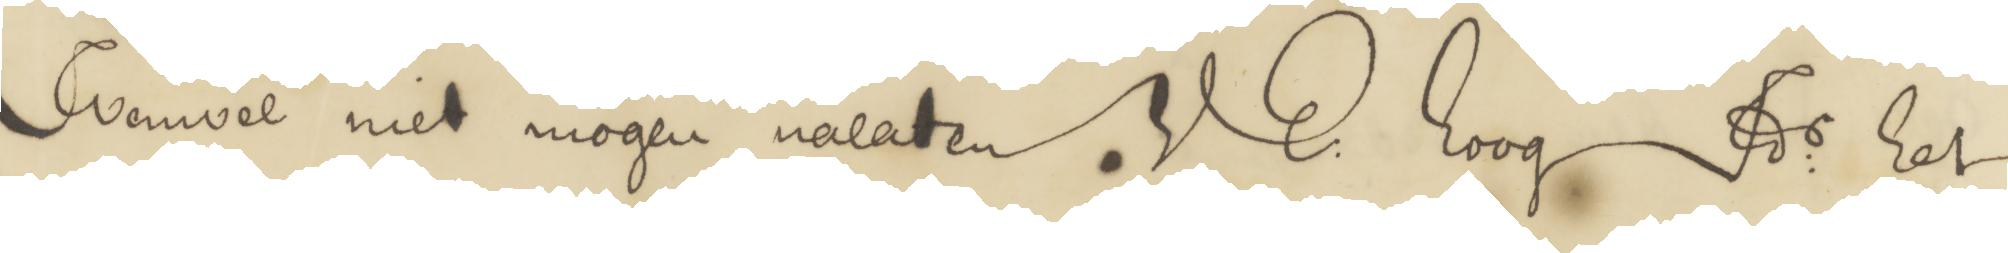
Evenwel niet mogen nalaten VE: hoog Ed:s het
